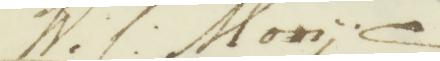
W: C: Mooij
